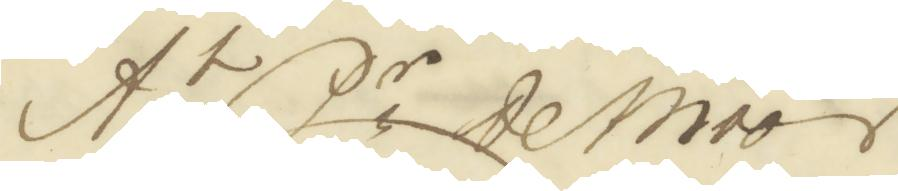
A:t P„r De Moor
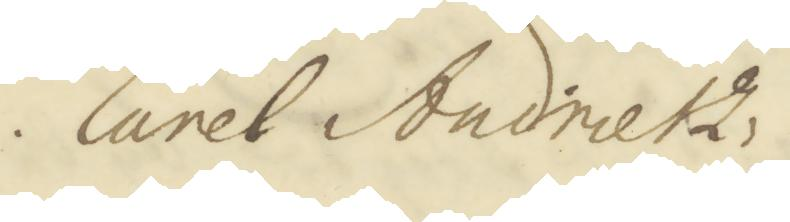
. Carel Andriesz:
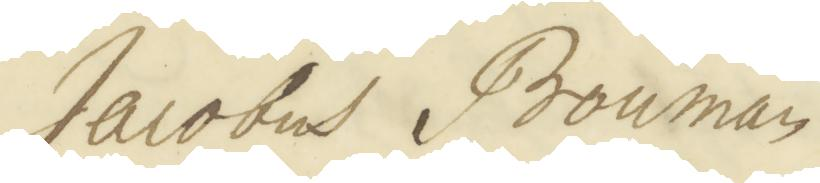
Jacobus Bouman
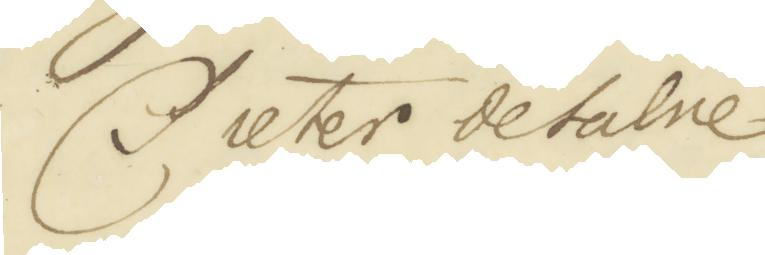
Pieter de salve
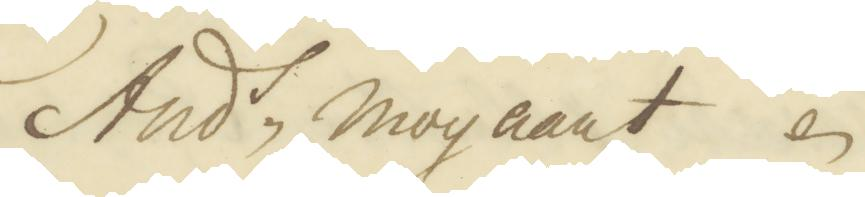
And„s moyaart en
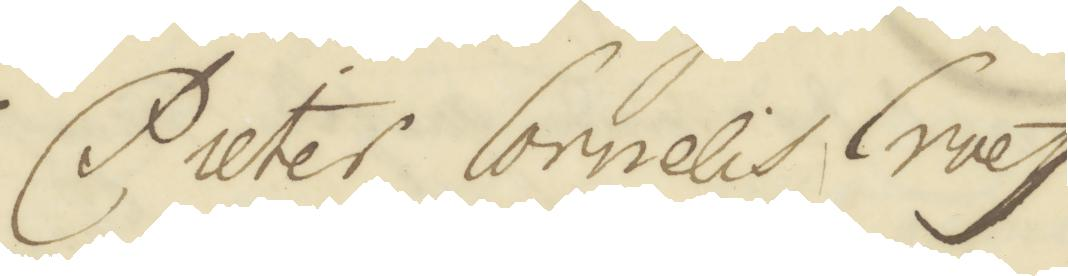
Pieter Cornelis Croef
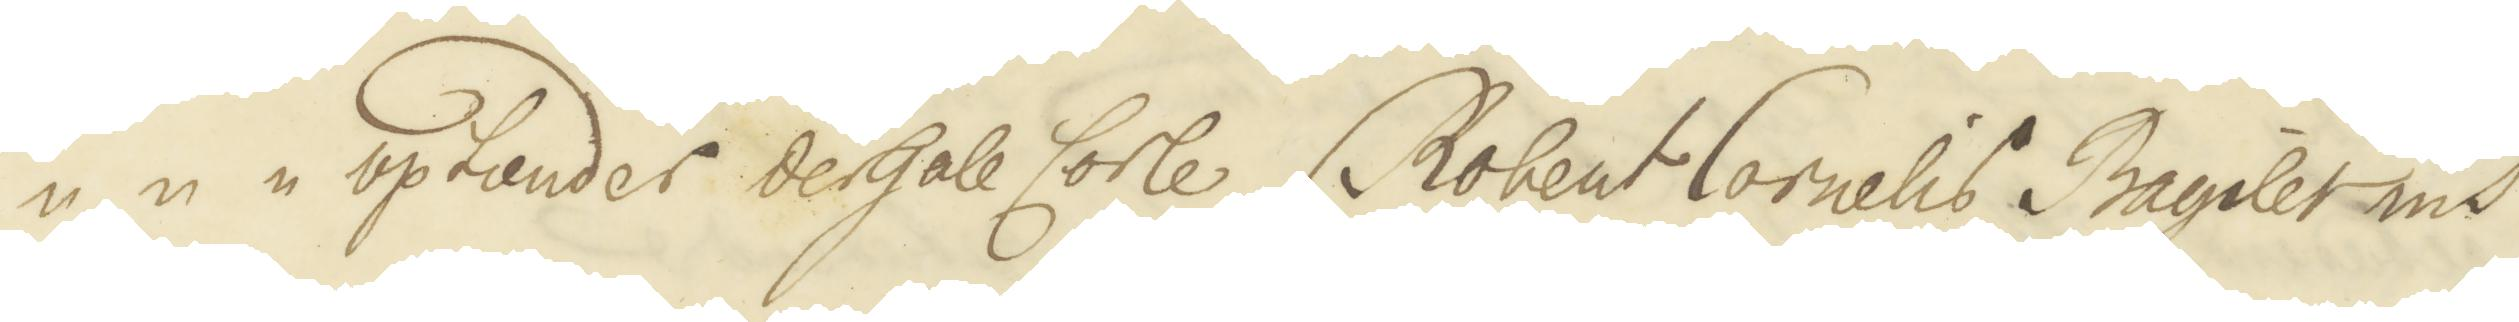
„ „ „ op siender der Gale Corle Robert Cornelis Bagilet ins
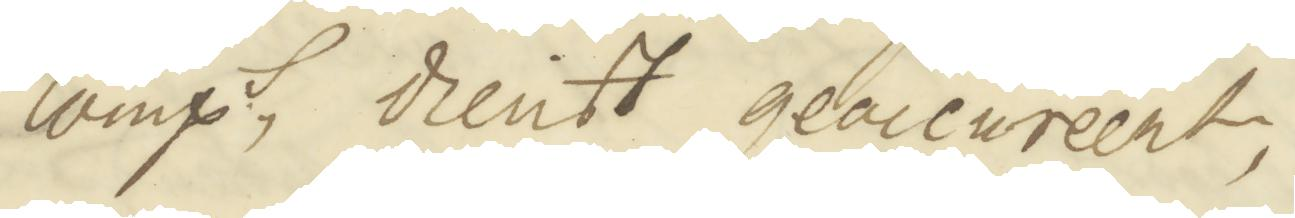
Comp„s dienst geoccureert,
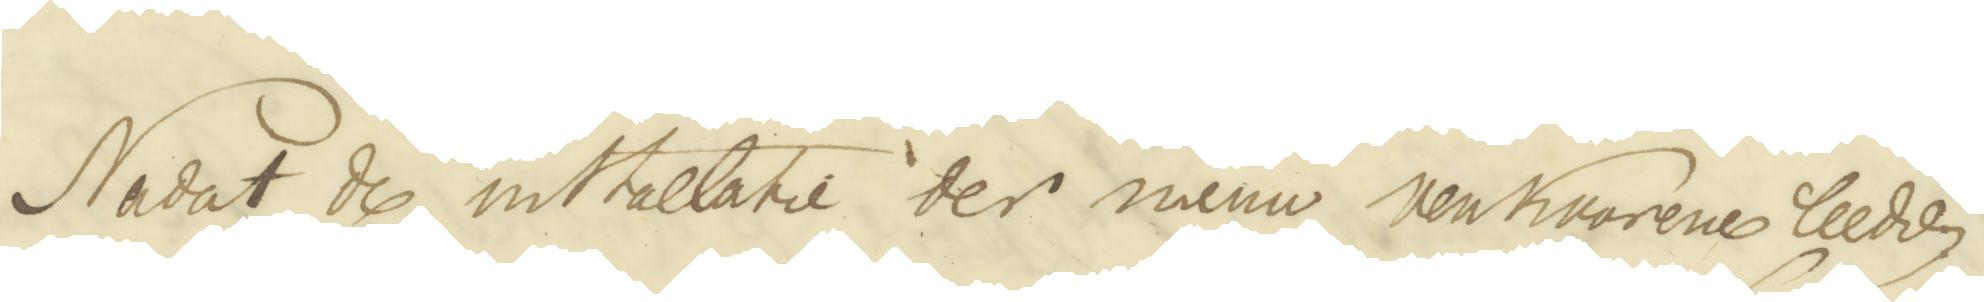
Nadat de installatie der nieuw verkoorene leeden
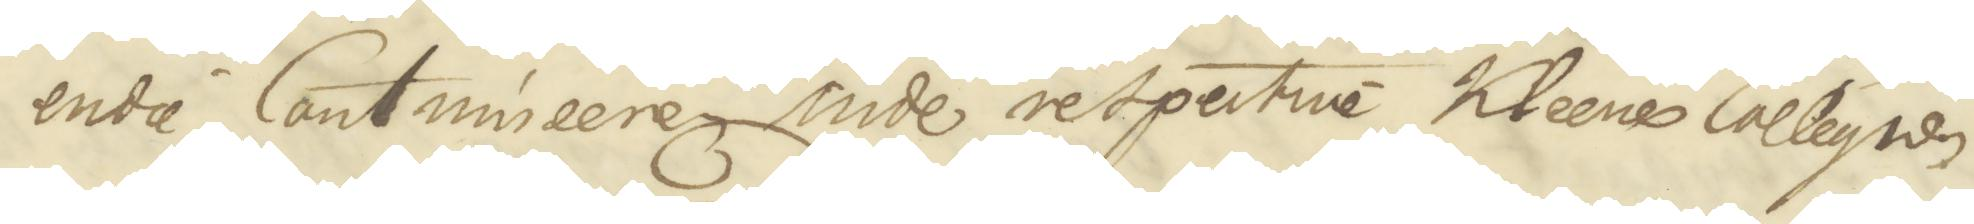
ende Continueeren inde respective kleene Colleyten
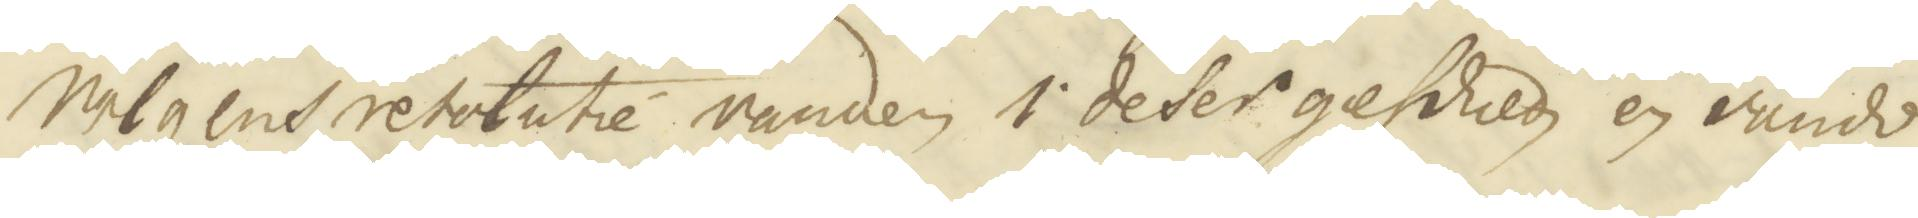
volgens resolutie vanden 1' deser geschieden en vande
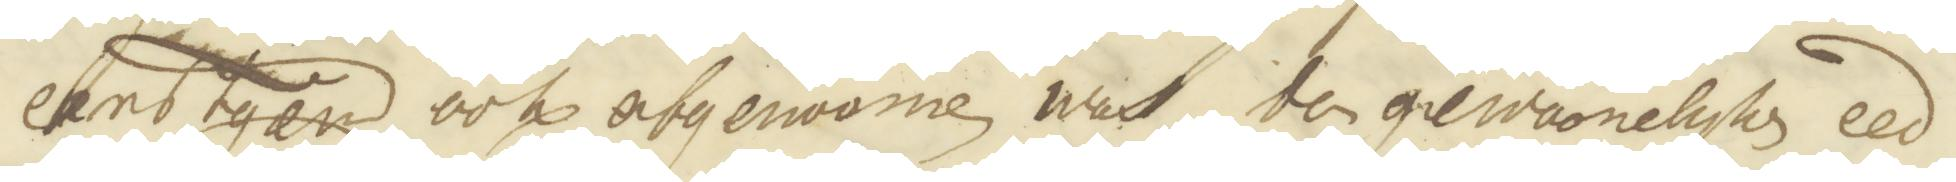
eerstgen ook afgenoomen was ten gewoonelyken eed
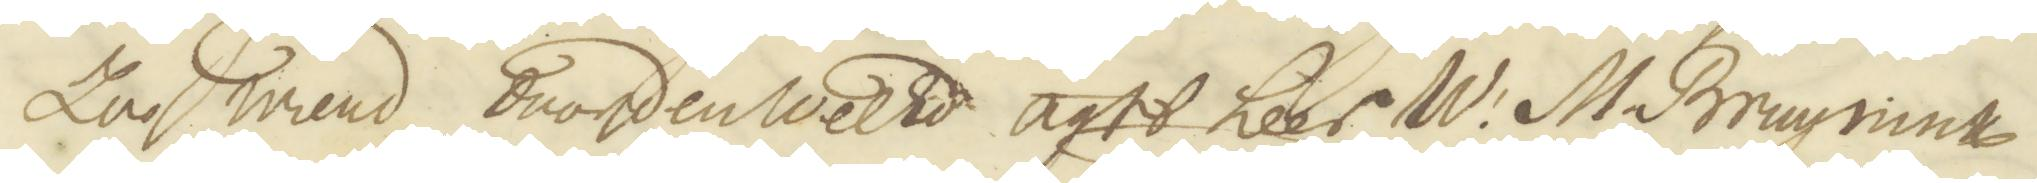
zoo wierd door den welEd agtb heer W: M. Bruynink
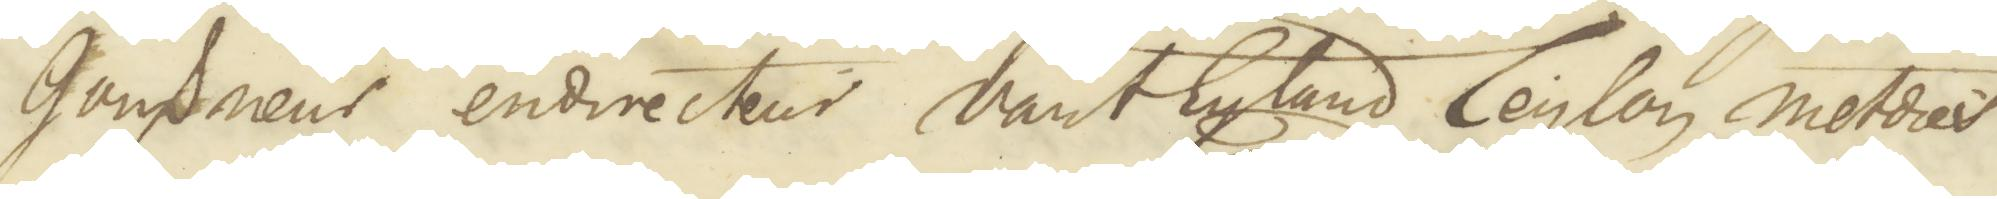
gouverneur endirecteur van 't Eyland Ceylon met dies
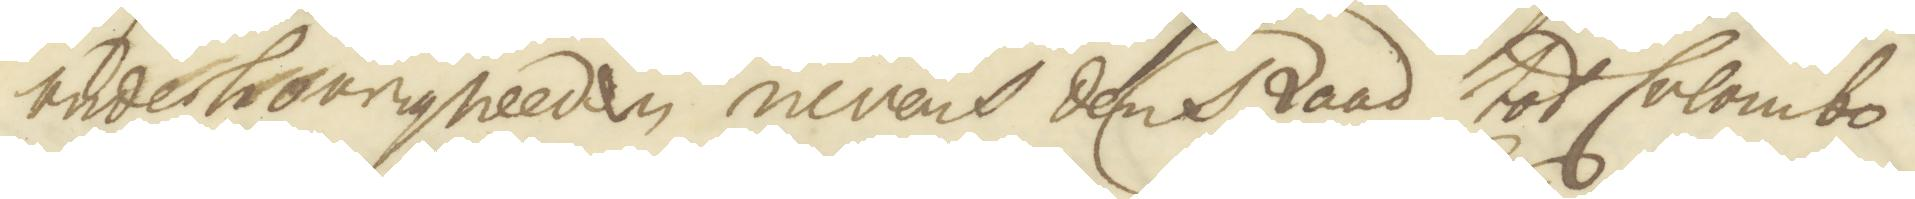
onderhoorigheeden nevens den Raad tot Colombo
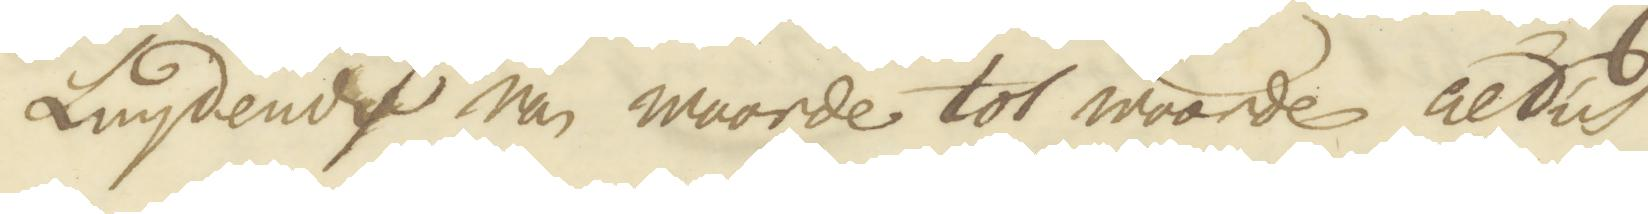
Luydende van woorde tot woorde aldus
